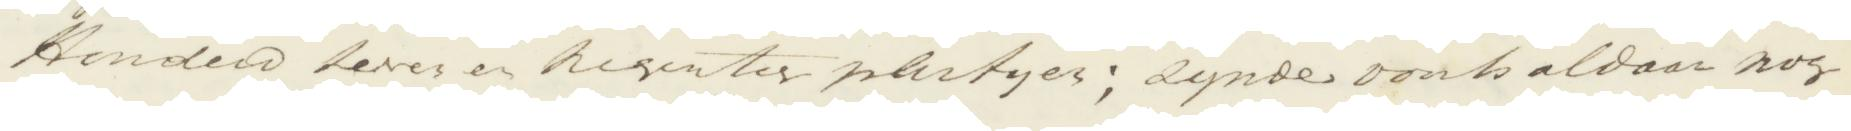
Honderd zeven en negentig partyen; zynde voorts aldaar nog
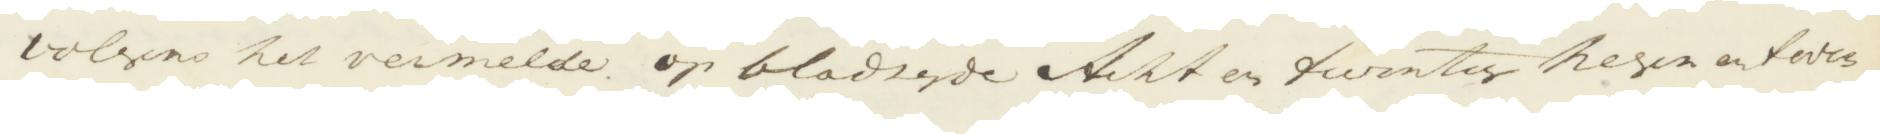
volgens het vermelde. op bladzyde Acht en twintig negen en twin
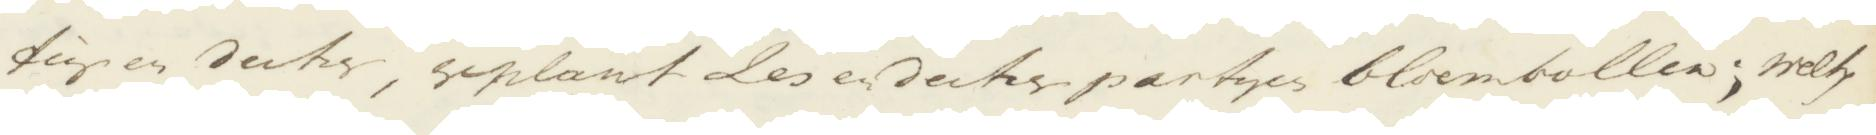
tig en dertig, geplant Zes en dertig partyen bloembollen; welk
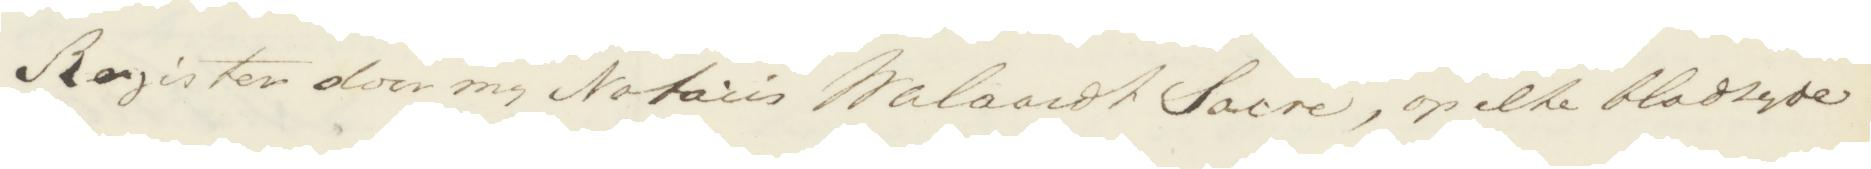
Register door my Notaris Walaardt Sacré, op elke bladzyde
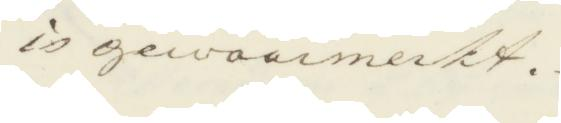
is gewaarmerkt.
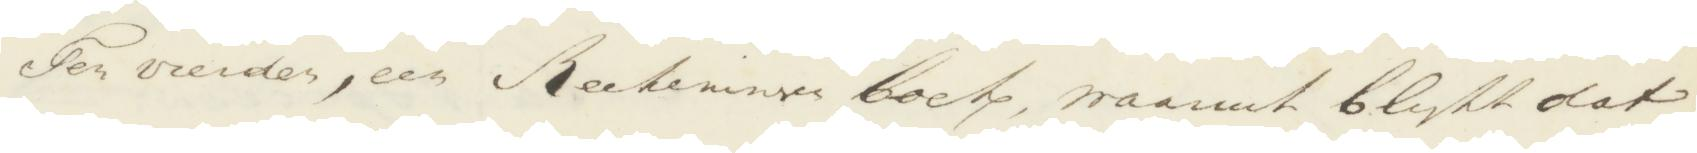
Ten vierden, een Reekeningen boek, waaruit blykt dat
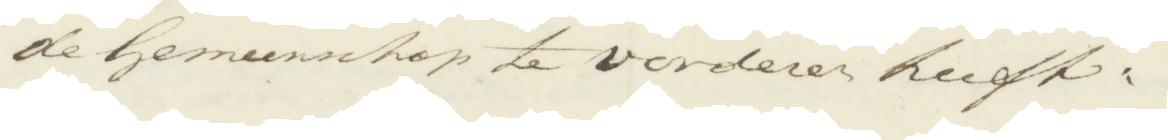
de Gemeenschap te vorderen heeft:
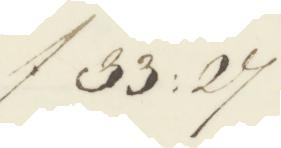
ƒ33: 27
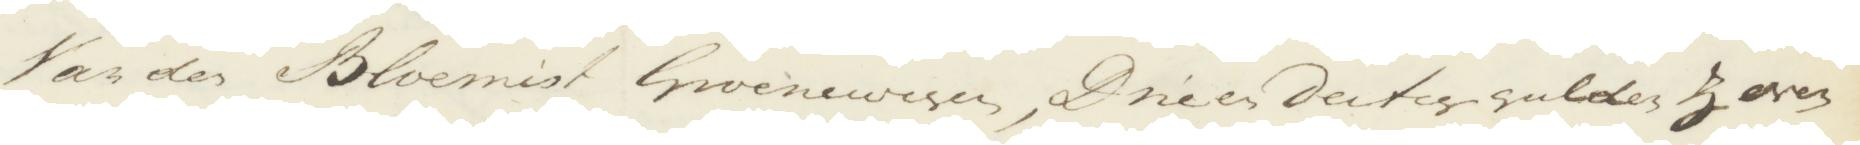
Van den Bloemist Groenewegen, Drie en dertig gulden Zeven
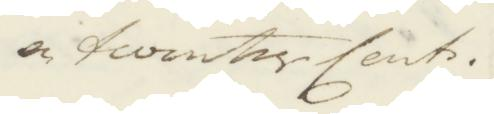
en twintig Cents.
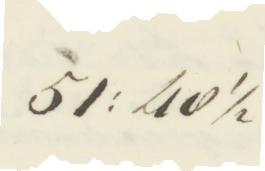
51: 48½
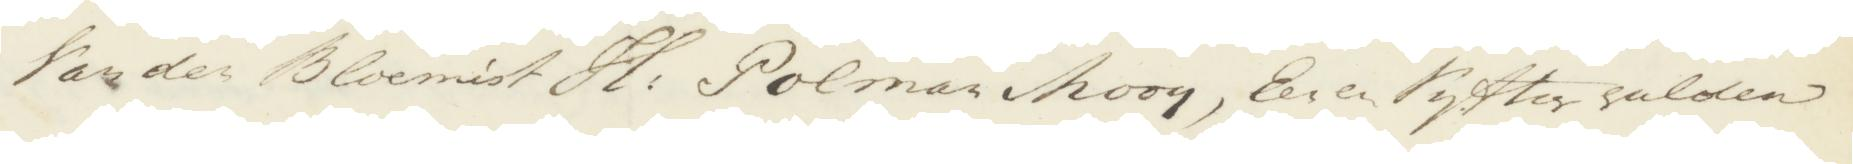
Van den Bloemist H: Polman hoog, Een en Vyftig gulden
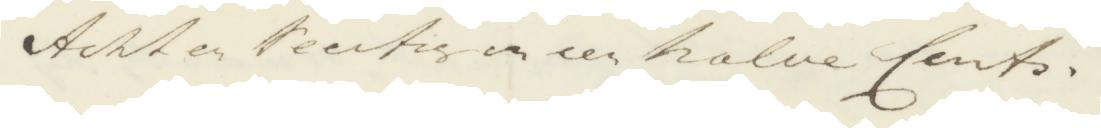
Acht en Veertig en een halve Cents.
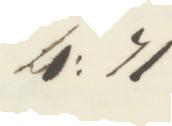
4: 71
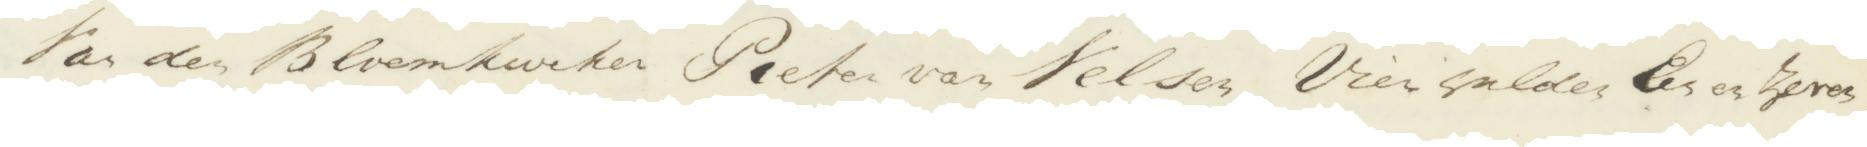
Van den Bloemkweker Pieter van Velsen Vier gulden Een en zeven
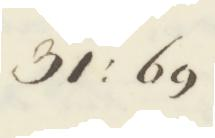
31: 69
